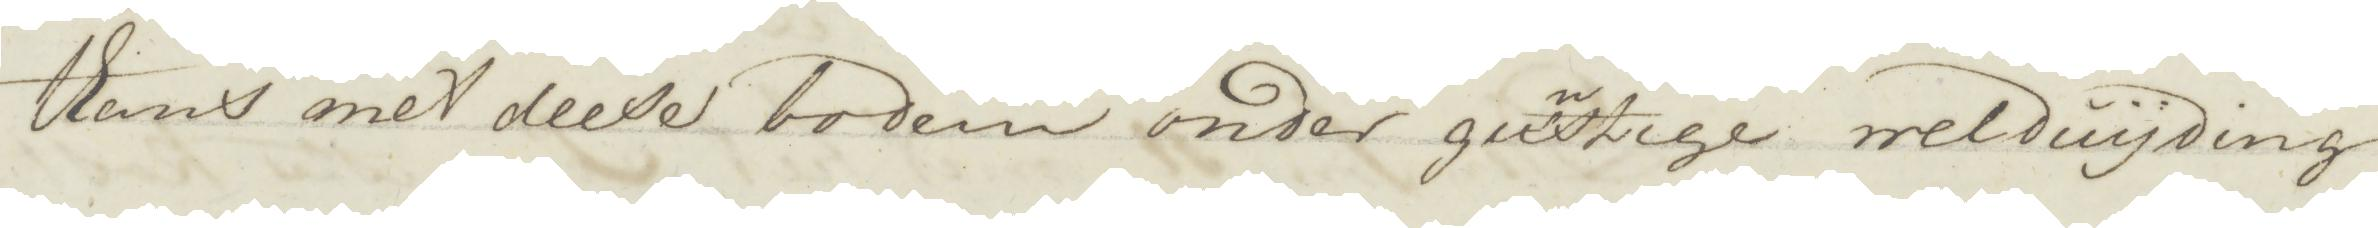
thans met deese bodem onder gunstige welduijding
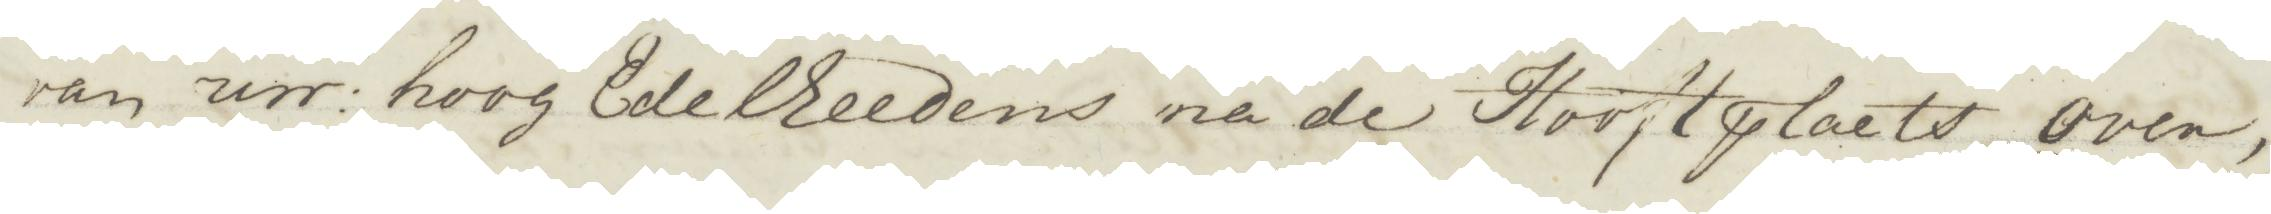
van uw: hoog Edelheedens na de Hooftplaets over,
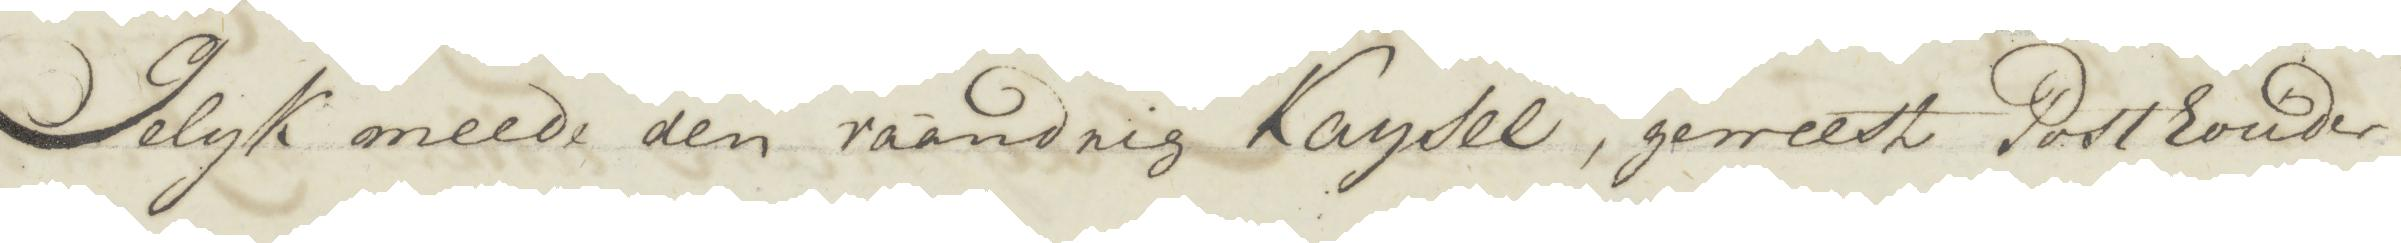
Gelyk meede den vaandrig Kaysel, geweest Posthouder
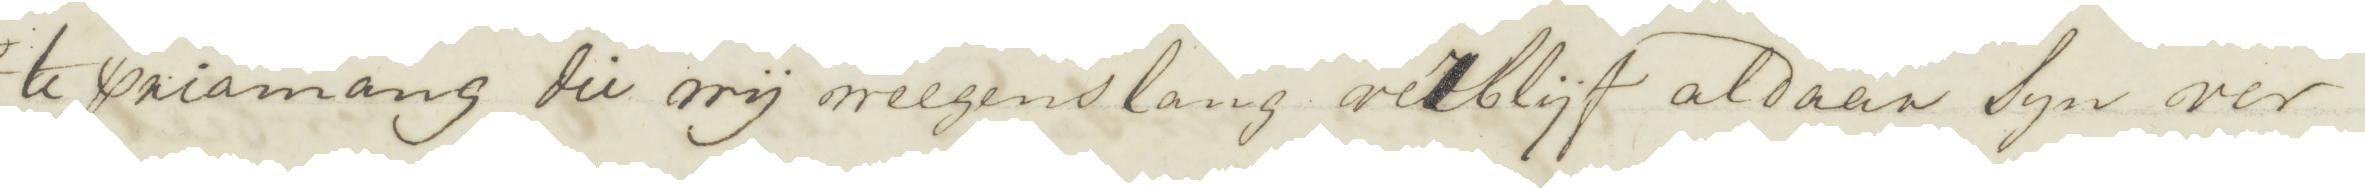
te priamang die wij weegens lang verblijf aldaar syn ver
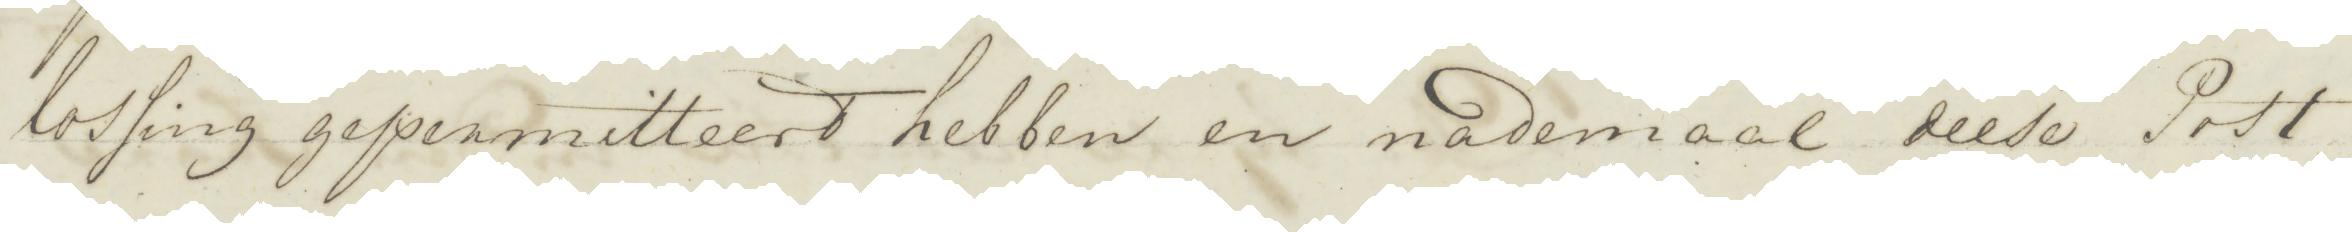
lossing gepermitteerd hebben en nademaal deese Post
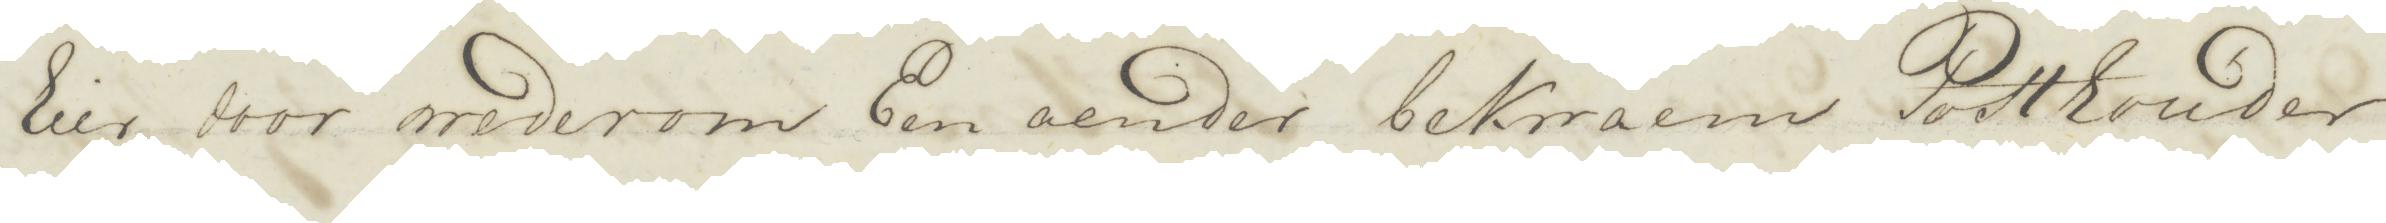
hier door wederom Een aender bekwaem Posthouder
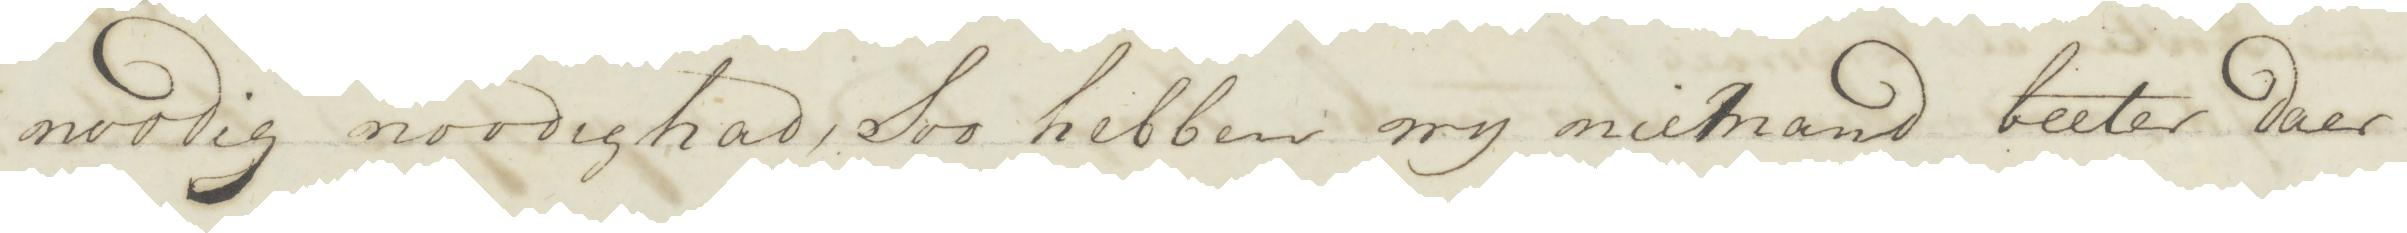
noodig noodig had, soo hebben wy niemand beeter daer
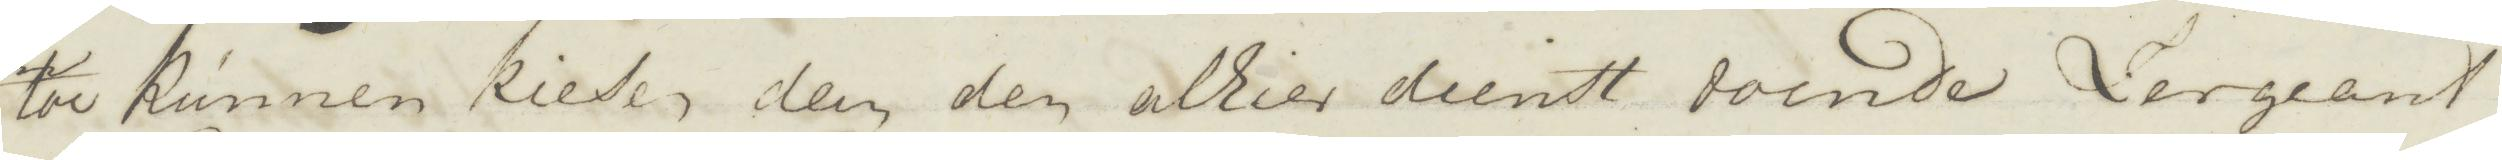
toe kunnen kiesen dan den alhier dienst doende Sergeant
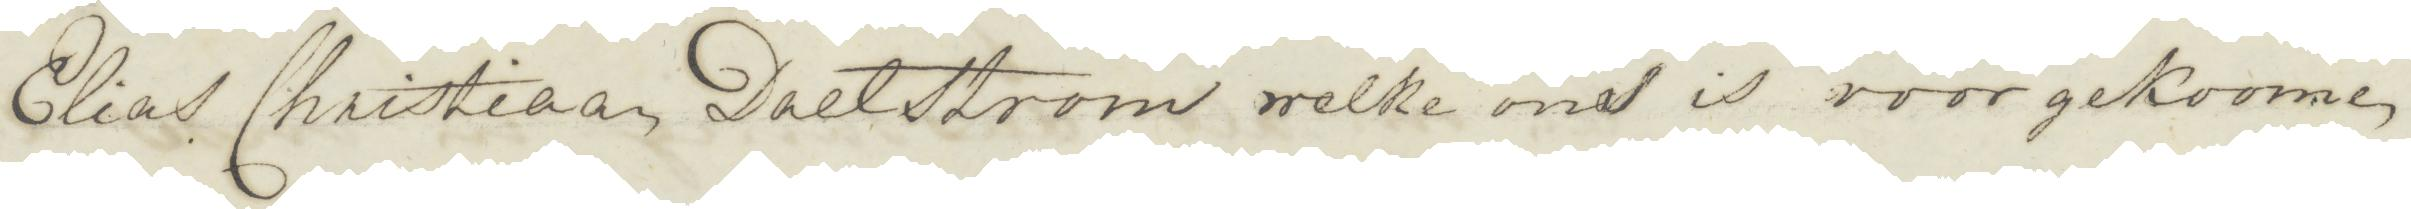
Elias Christiaan Daelstrom welke ons is voorgekoomen
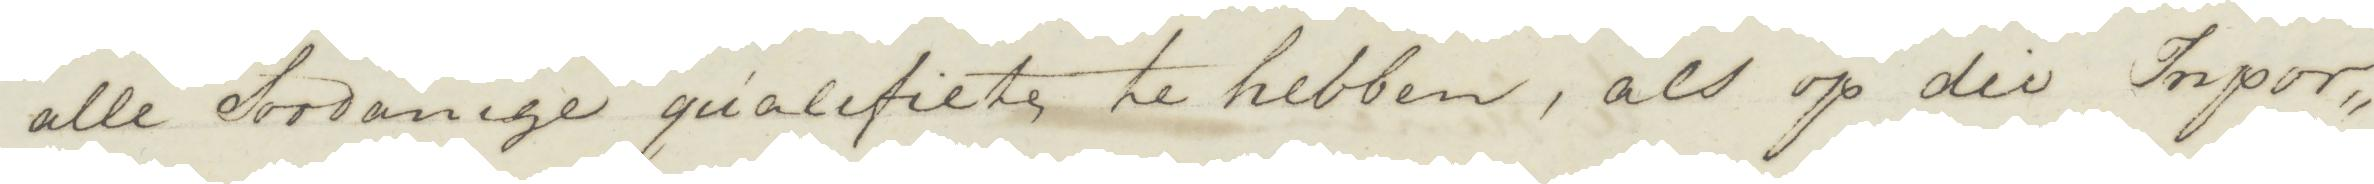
alle soodanige qualifieten te hebben, als op die Inpor„
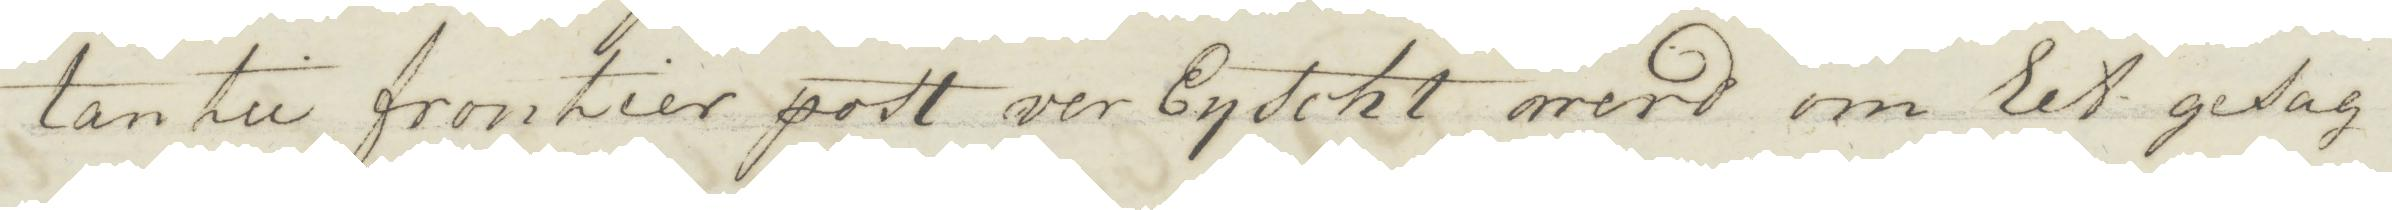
tantie frontier post ver Eyscht werd om het gesag
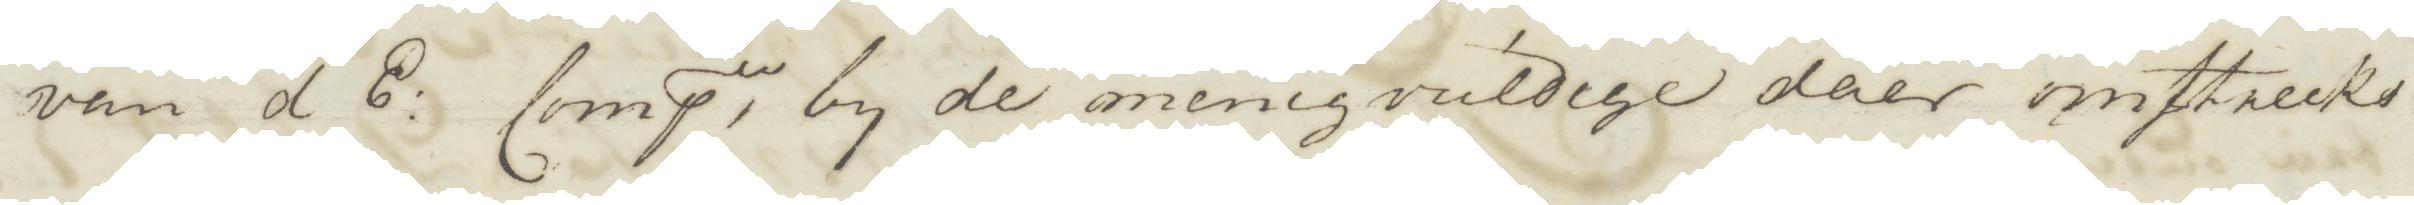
van 'd E: Comp,e bij de menigvuldige daer omstreeks
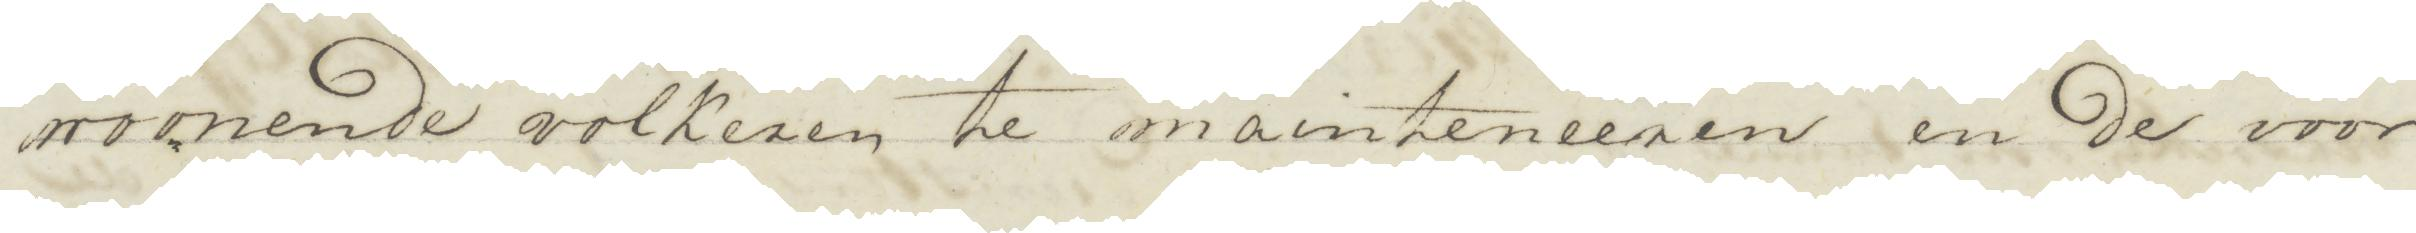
woonende volkeren te mainteneeren en de voor
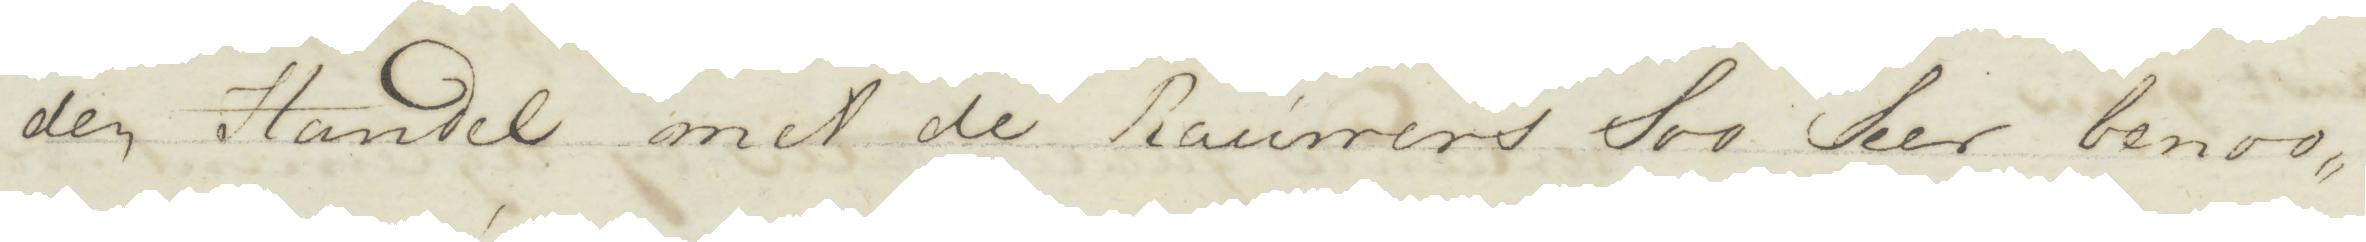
den Handel met de Rauwers soo seer benoo„
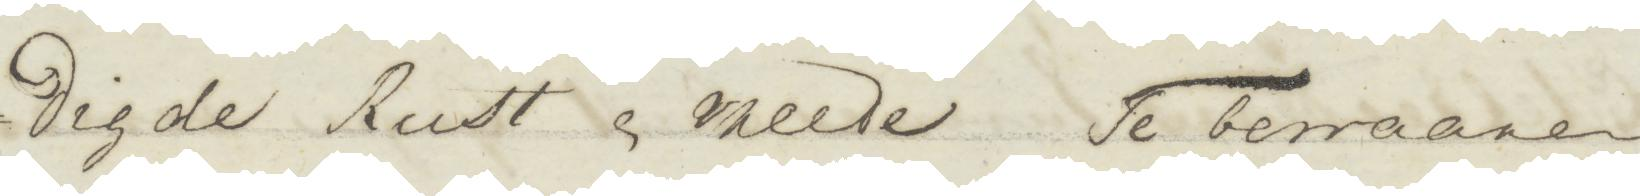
digde Rust en vreede Te bewaaren
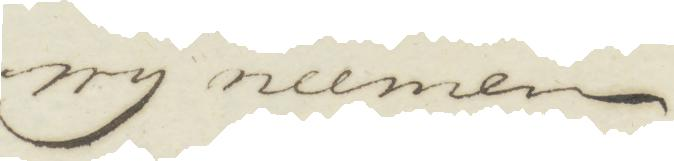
wy neemen
